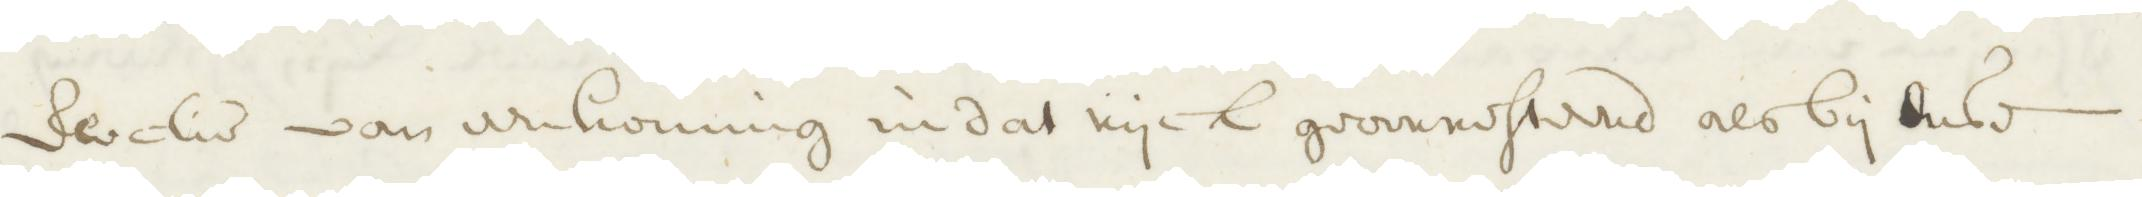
Electie van een koning in dat rijck geaerresteerd als bij onse
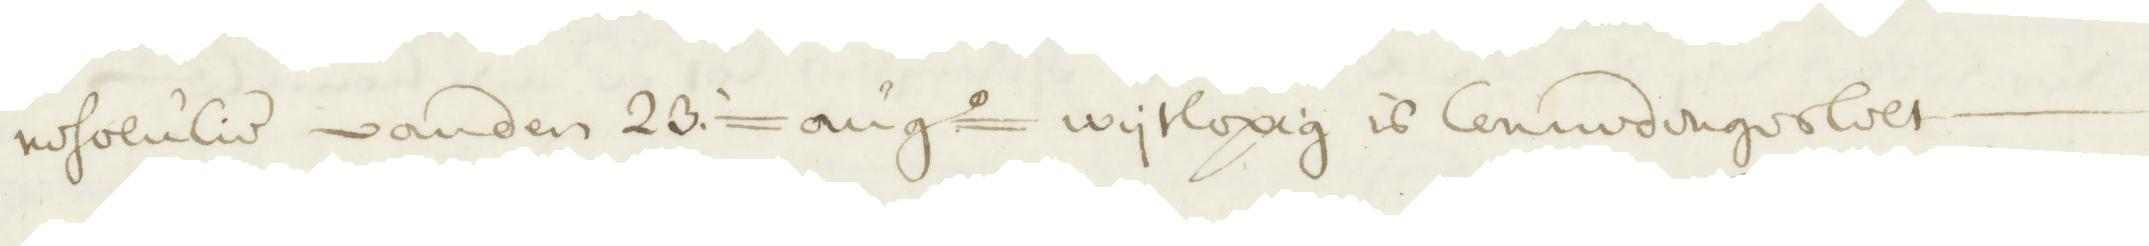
resolutie van den 23.=' aug=o wijtlopig is ter nedergestelt —
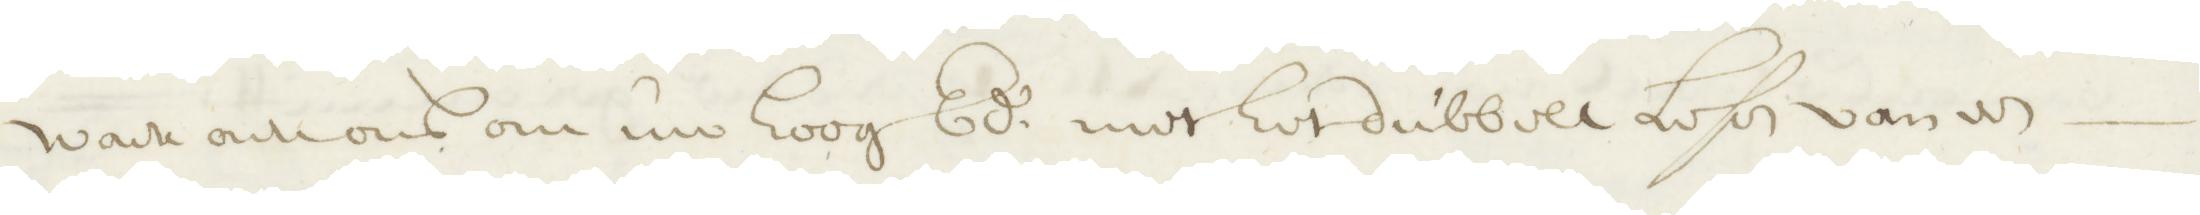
waer aen ons om uw hoog Ed: met het dubbelt lesen van een —
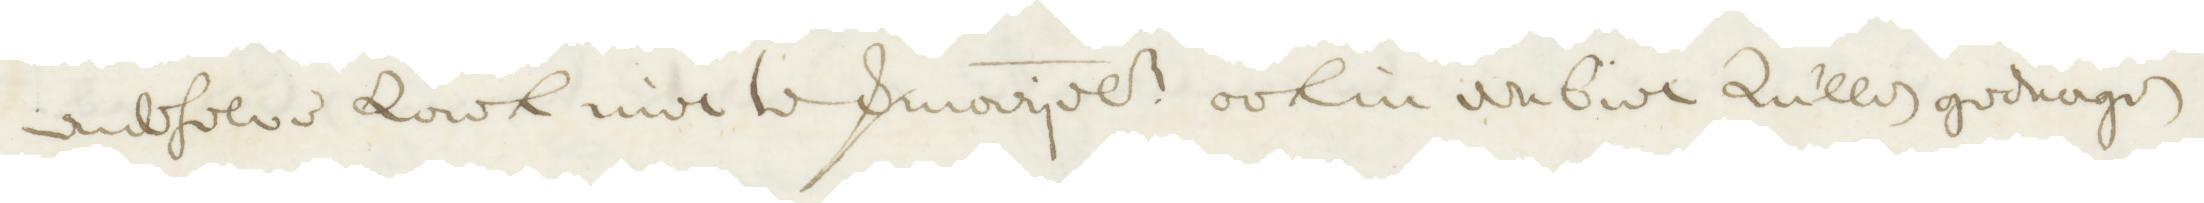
endeselve zorek niet te vermoeijelijk ook in eerbiet zullen gedragen
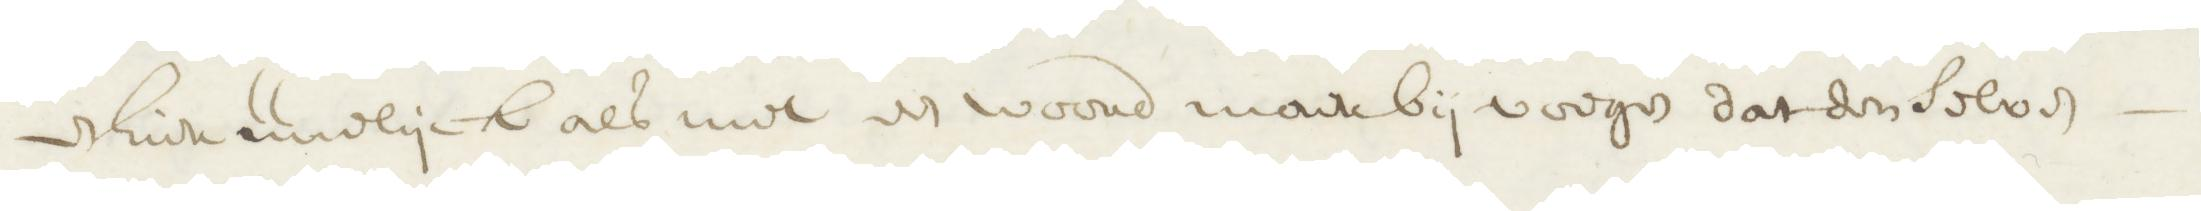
en hier eenelijck als met een woord maer bij voegen dat den selven —
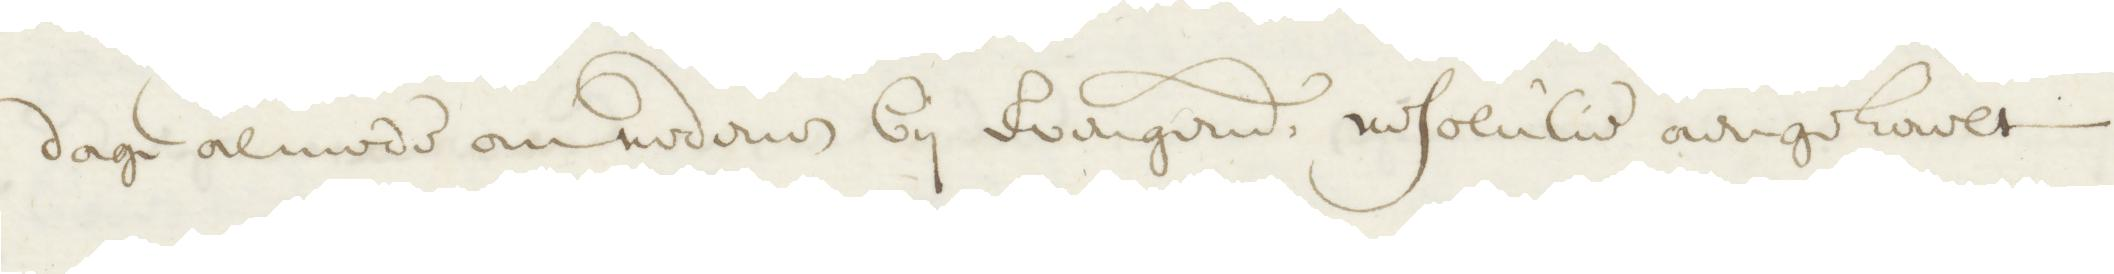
dage almede om redenen bij Evengem: resolutie aengehaelt
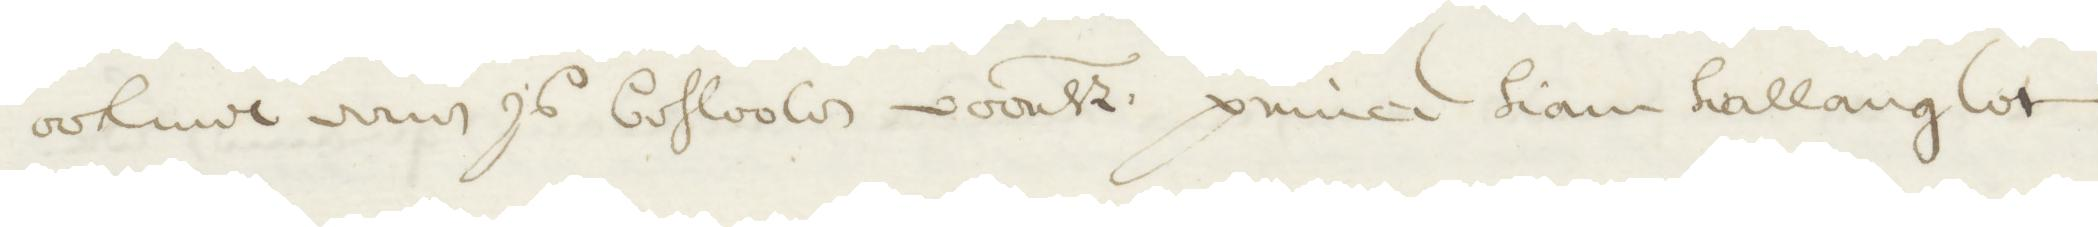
ook met eenen js beslooten voorsz: prince siam sallang tot
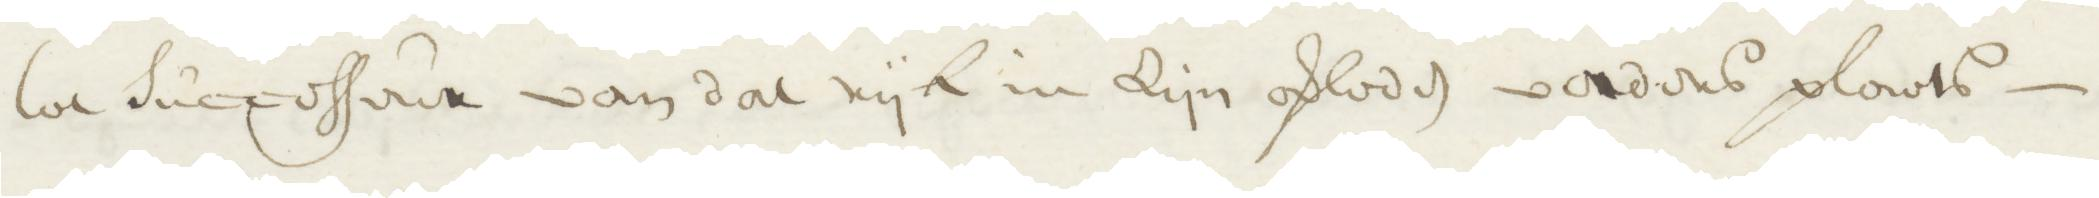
tot successeur van dat rijk in zijn overleden vaders plaets —
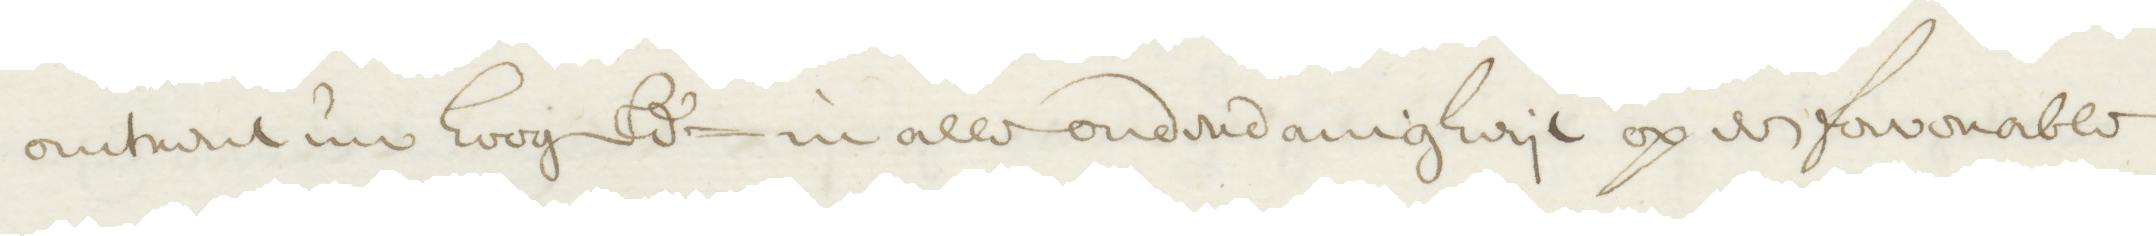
omtrent uw hoog Ed= in alle onderdanigheijt op een favorable
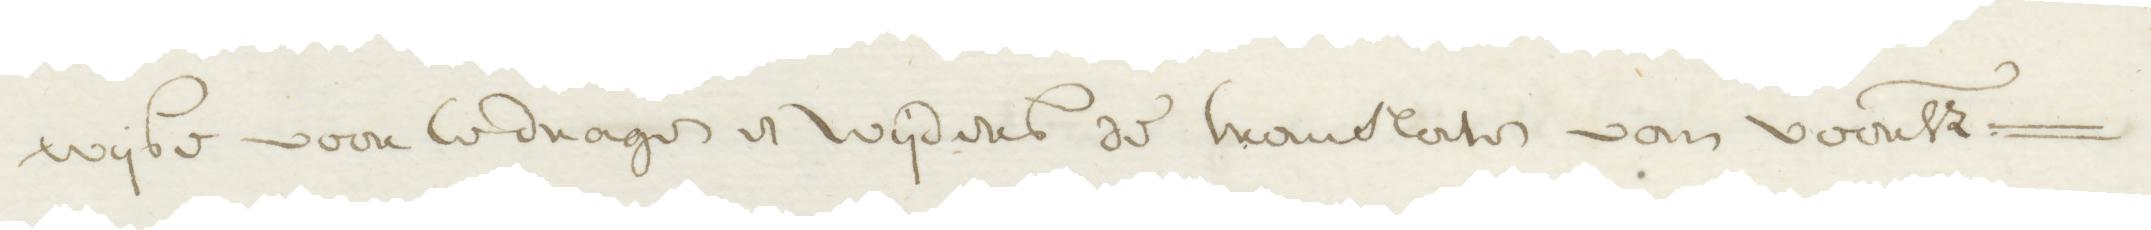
wijse voor te dragen en wijders de translaten van voorsz:=
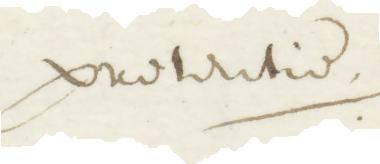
pretentie.
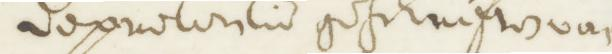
depretentie geschriften van
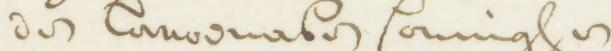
den Tanoemesen Coningh en
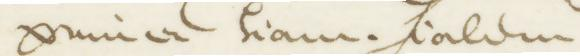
prince siam. sialem
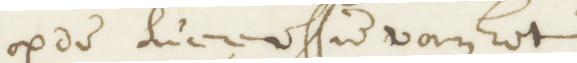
op de successie van het
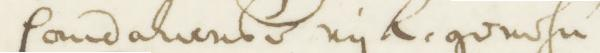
Candahierse rijk. geresu
